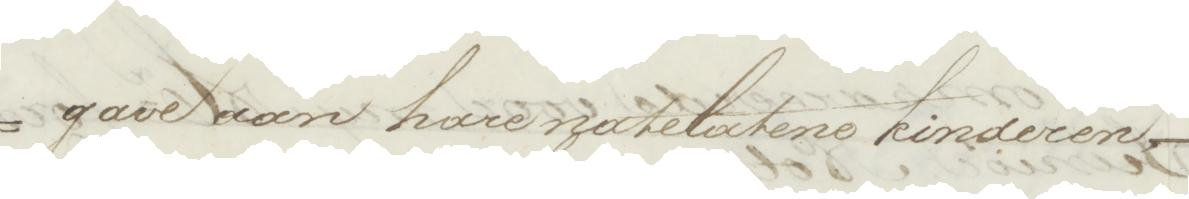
„gave aan hare natelatene kinderen. —
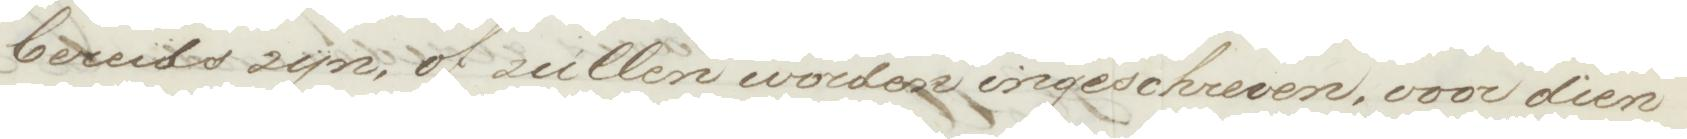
bereits zijn, of zullen worden ingeschreven, voor dien
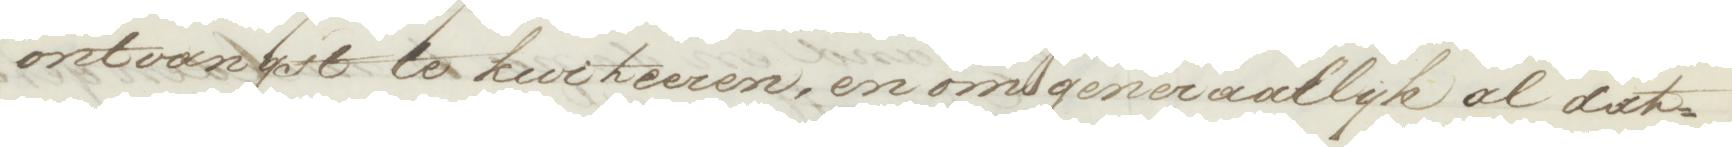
ontvangst te kurteeren, en om generaallijk al dat„
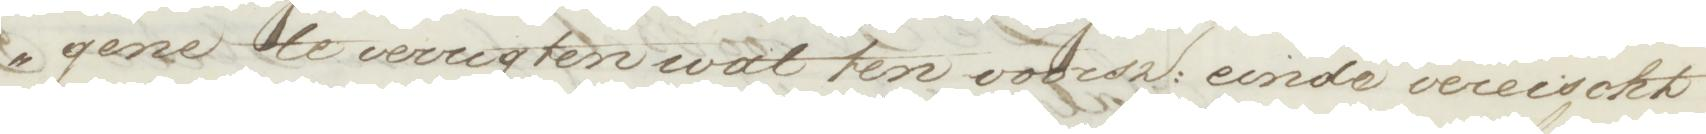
„gene te verrigten wat ten voorsz: einde vereischt
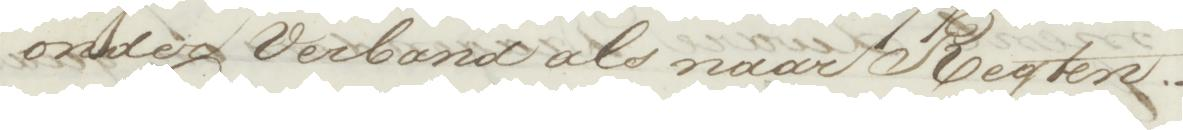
onder Verband als naar Regten.
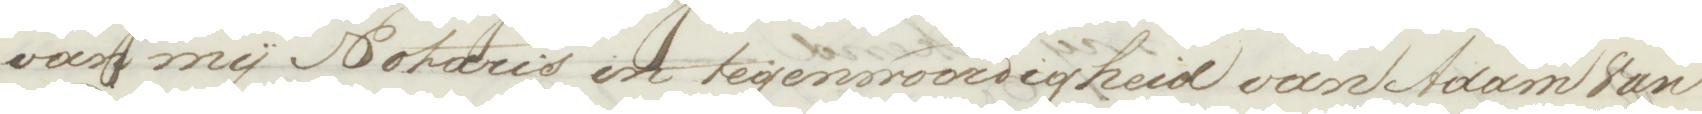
van mij Notaris in tegenwoordigheid van Adam van
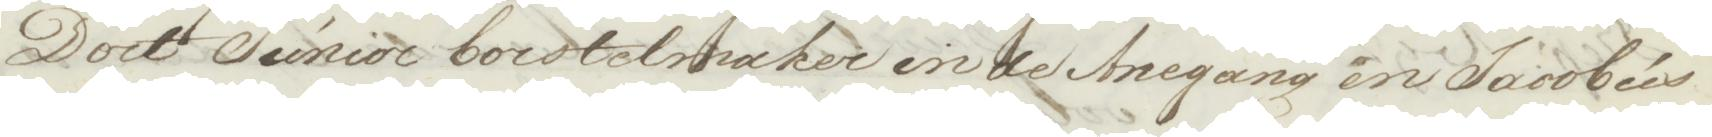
Dort Iunior borstelmaker in de Anegang en Iacobus
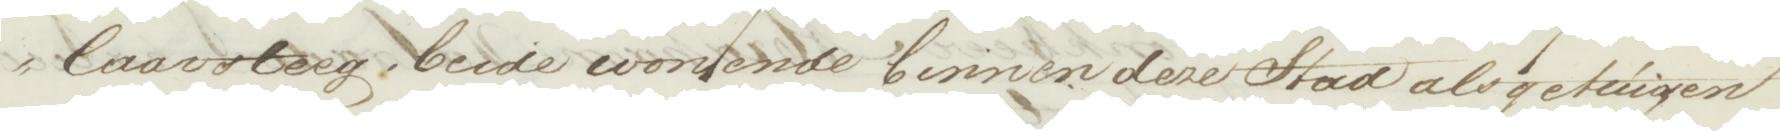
„laarsteig, beide wonende binnen deze Stad als getuigen
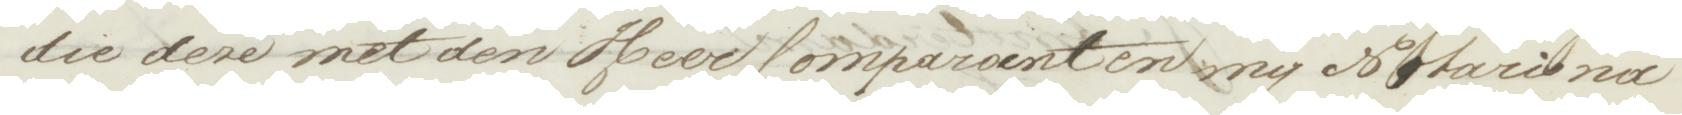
die deze met den Heer Comparant en my Notaris na
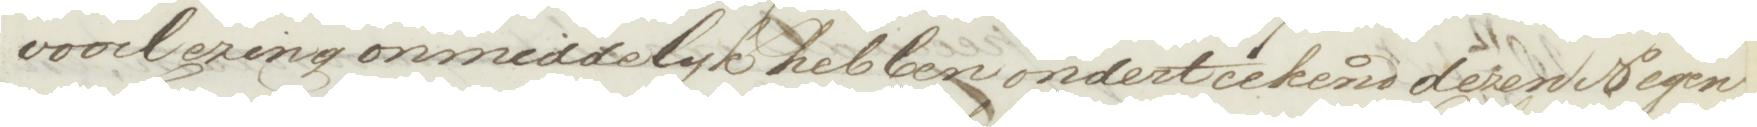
voorlezing onmiddelyk hebben onderteekend dezen Negen
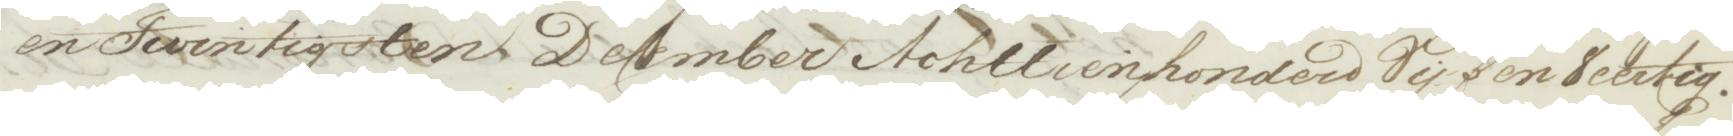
en Twintigsten December Achttienhonderd Vijf en Veertig
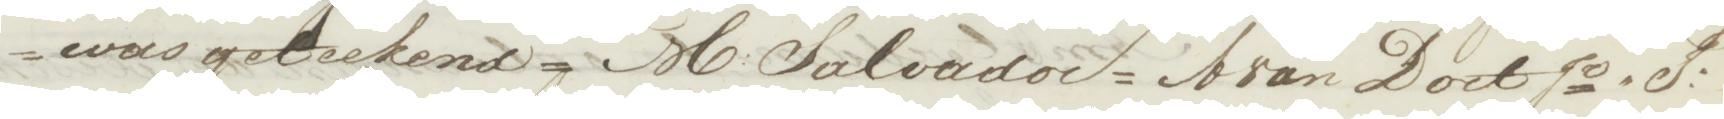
= was geteekend M: Salvador = A van Dort J=r I:
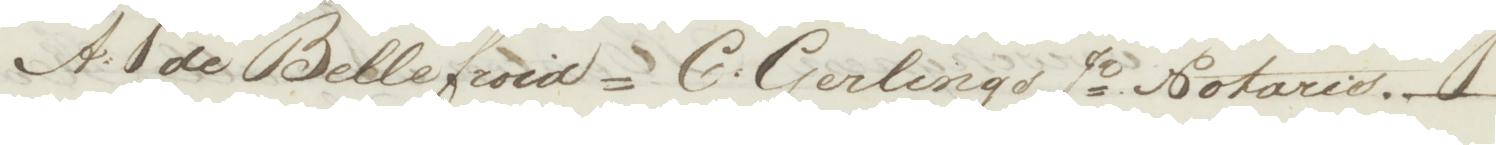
A: de Bellefroid = C. Gerlings J=o Notaris. —
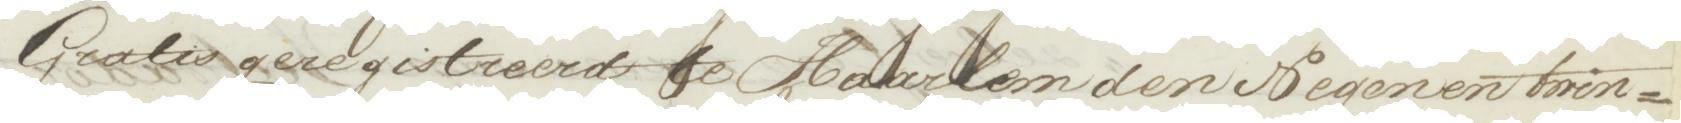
Gratis geregistreerd te Haarlem den Negen en twin„
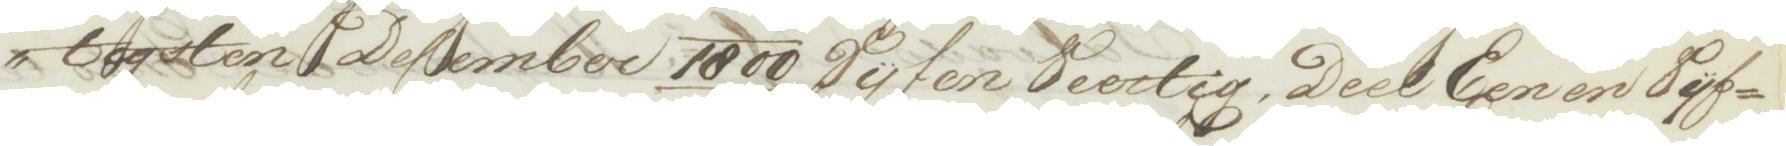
„tigsten December 1800 Vijfen Veertig, Deel Een en Vijf„
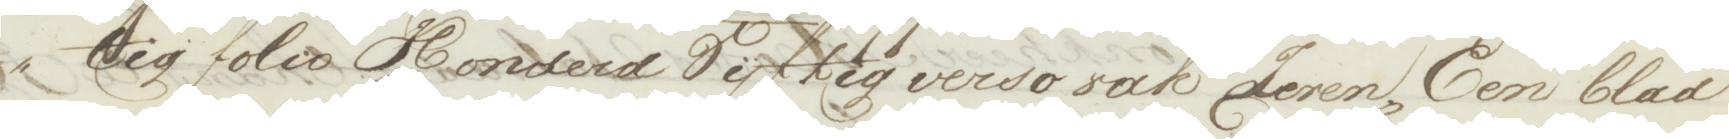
„tig folio Honderd Vijftig verso vak zeven, Een blad
